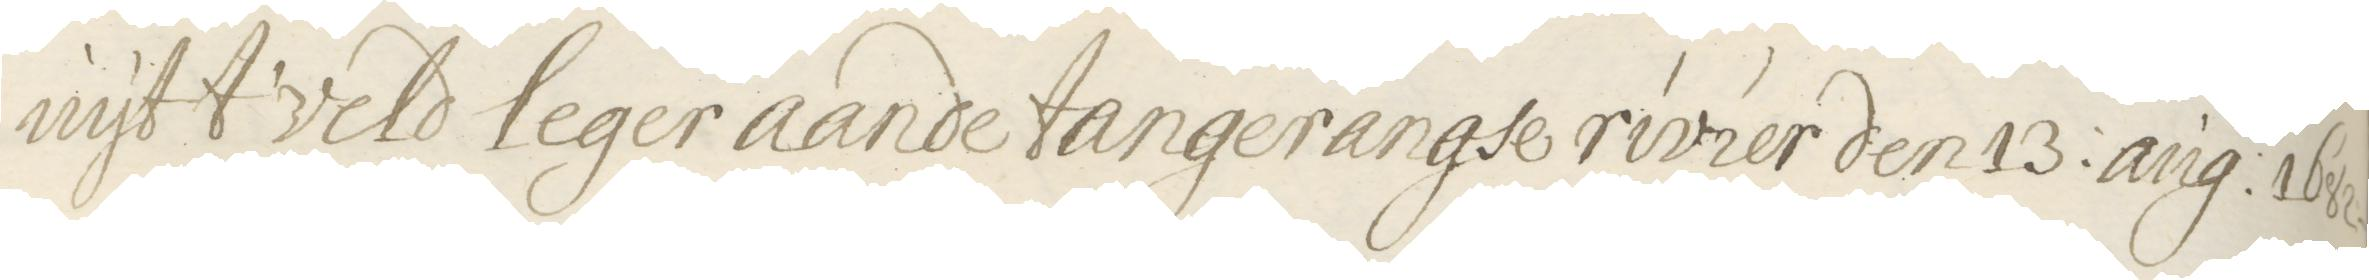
uijt t' veld leger aande tangerangse rivier den 13: aug: 1682.
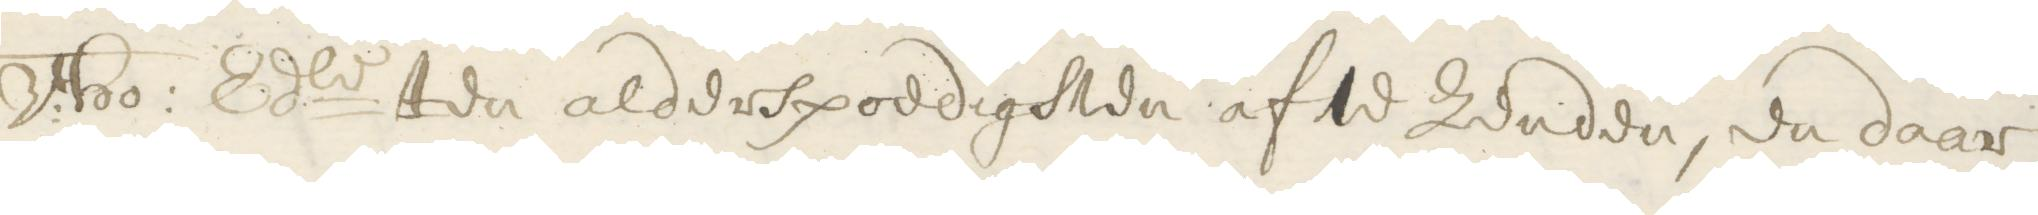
U:ho: Ed=le ten alderspoedigsten af te zenden, en daar
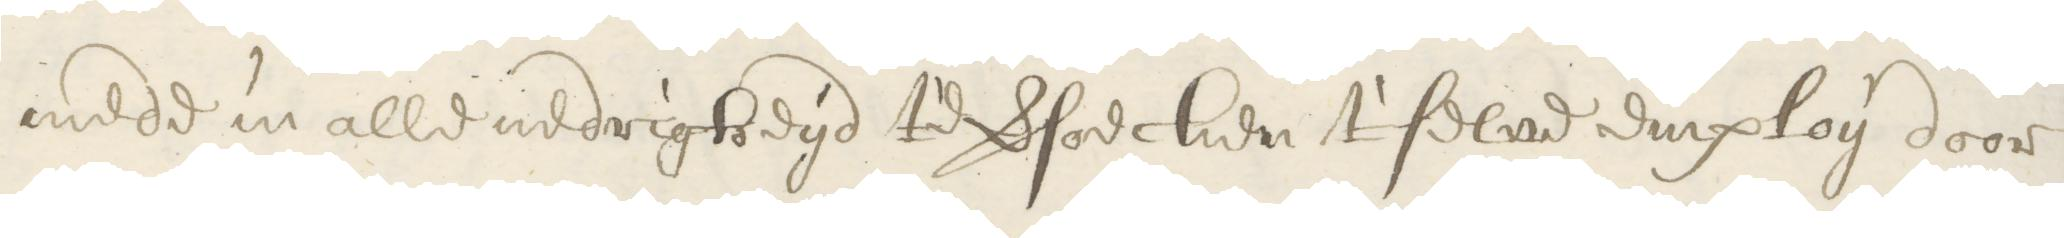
mede in alle nedrigheijd t'e versoecken t' selve emploij door
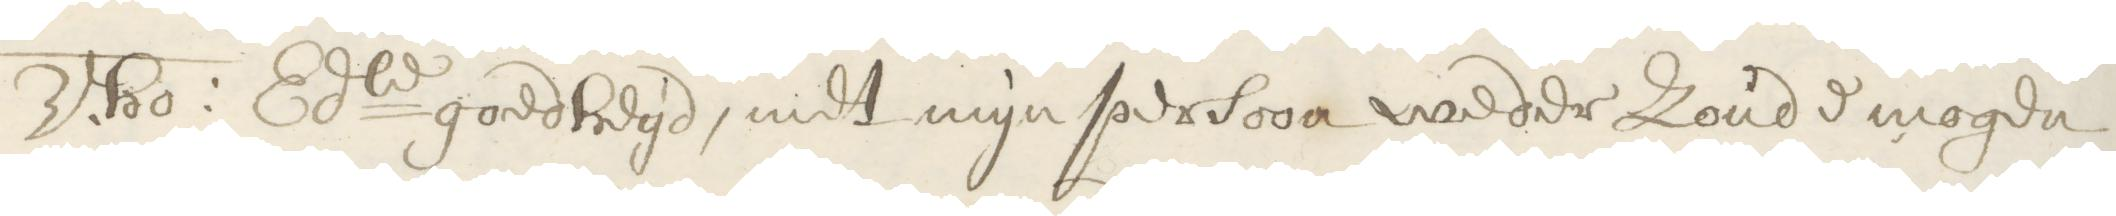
U:ho: Ed=le goedheijd, niet mijn persoon weder zoude mogen
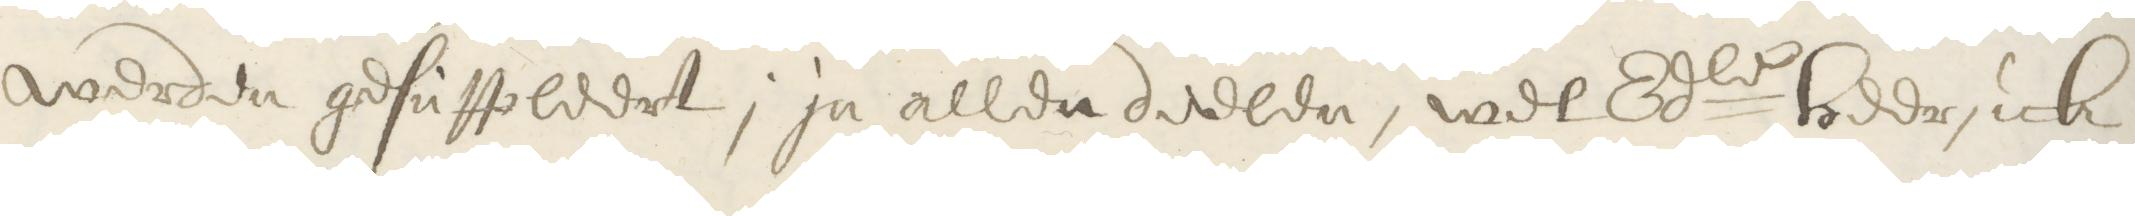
werden gesuppleert; in allen deelen, wel Ed=le heer, ick
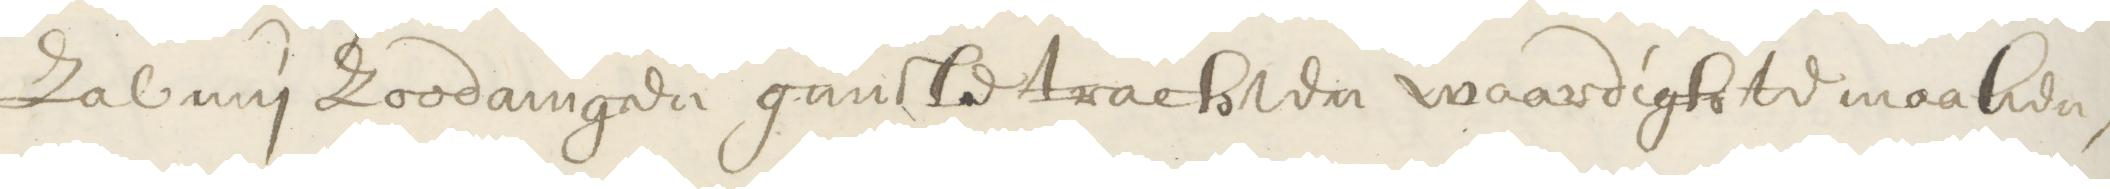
zal mij zoodanigen gunste trachten waardigh te maaken,
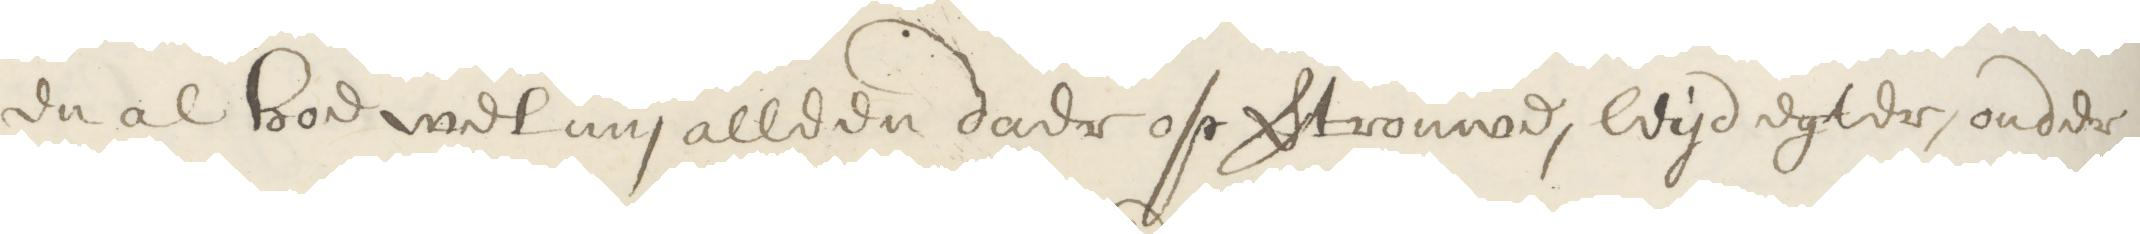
en al hoe wel mij allden daer op vertrouwe, leijd egter, onder
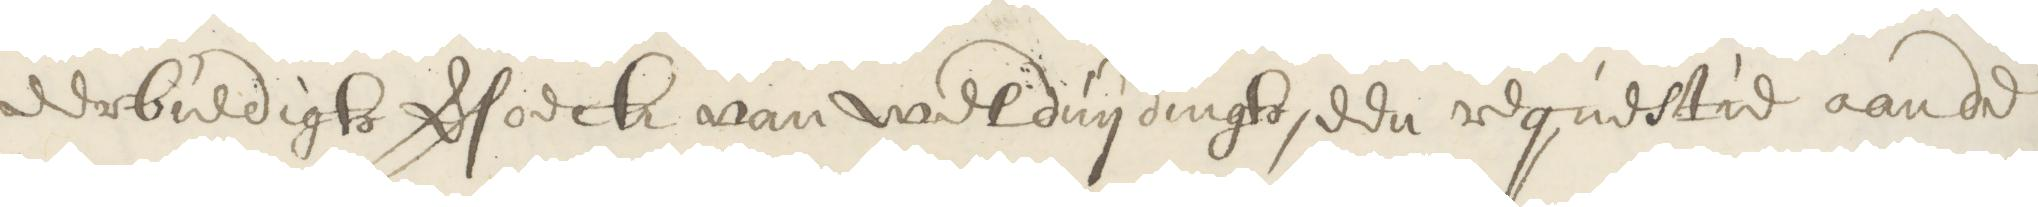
eerbiedigh versoeck van welduijdingh, een requestie aan de
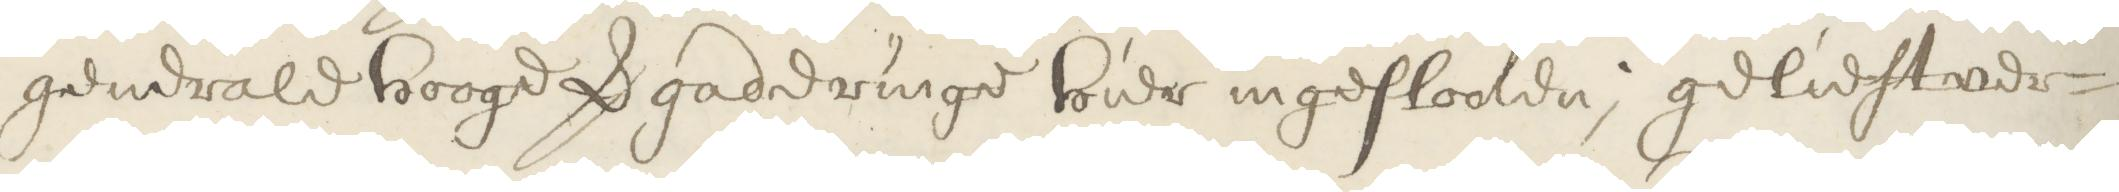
generale hooge vergaderinge hier ingeslooten; gelieft ver=
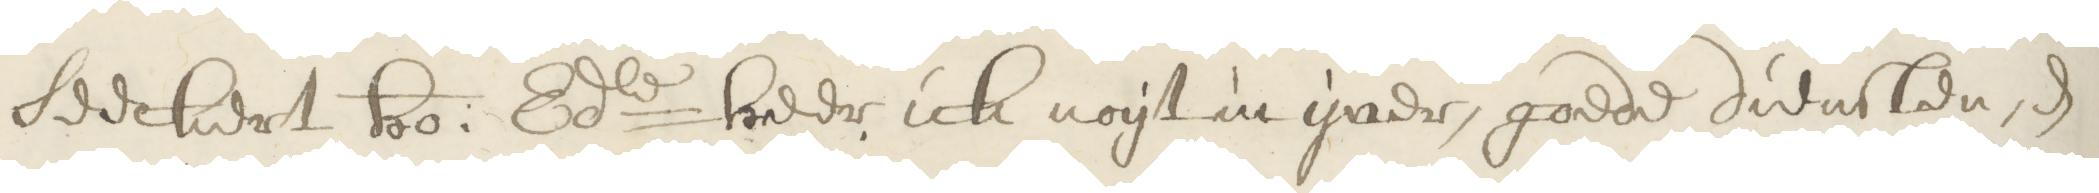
seeckert ho: Ed=le heer ick noijt in ijver, goede diensten, en
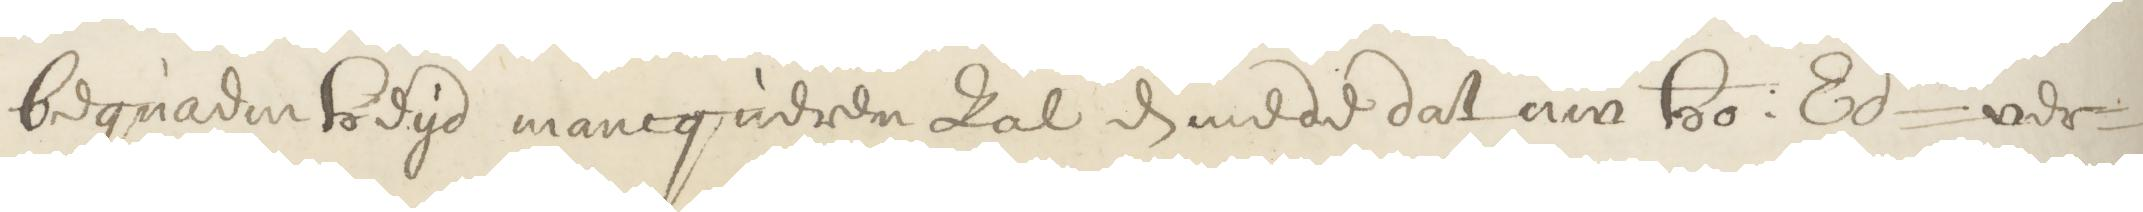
bequaemheijd mancqueren zal en mede dat uw ho: Ed= ver=
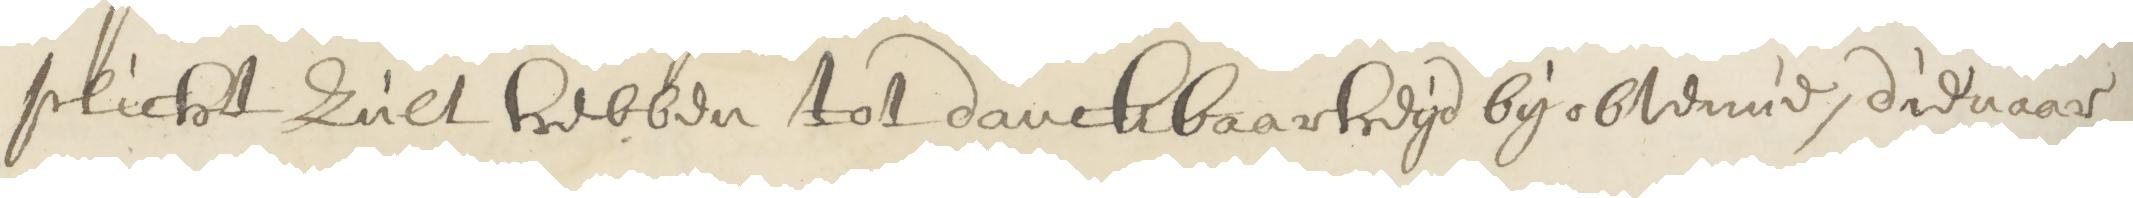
plicht zult hebben tot danckbaarheijd bij obtenue, die naar
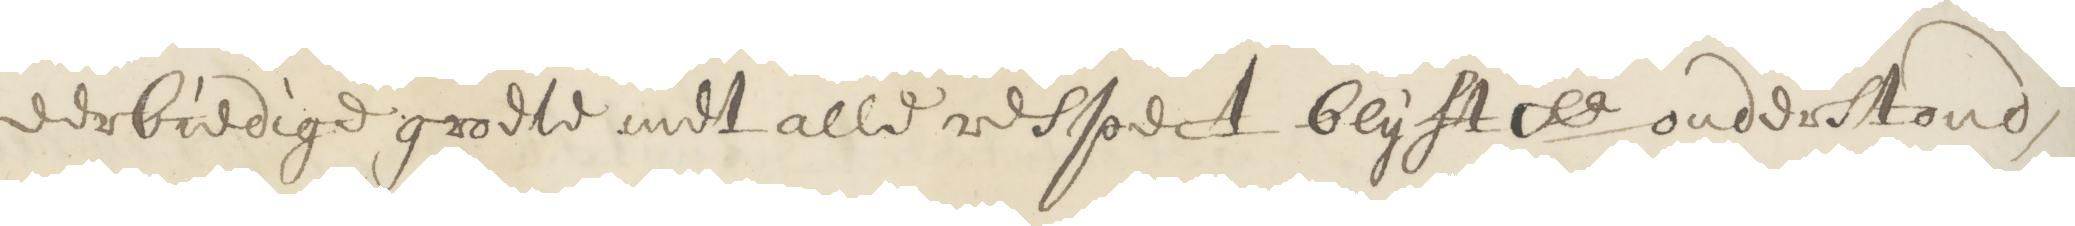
eerbiedige groete niet alle respect blijft de onderstond,
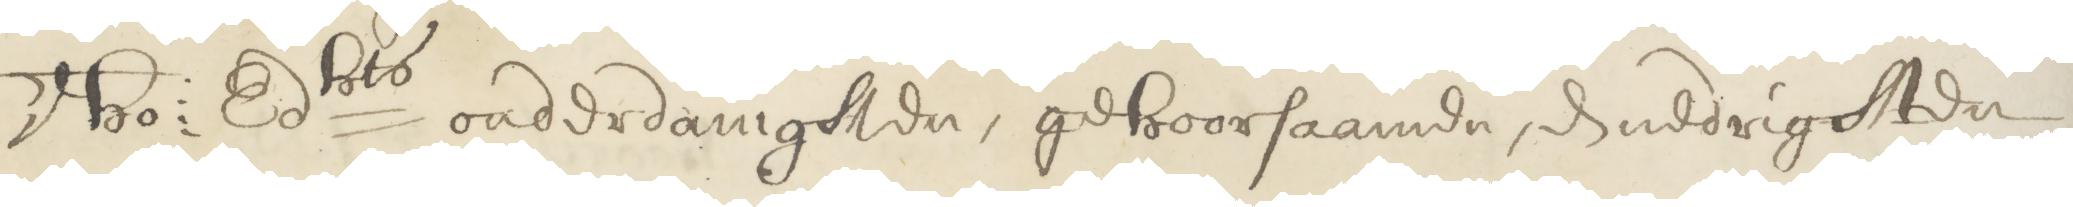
Vho:: Ed=hts onderdanigsten, gehoorsaamen, en nedrigsten
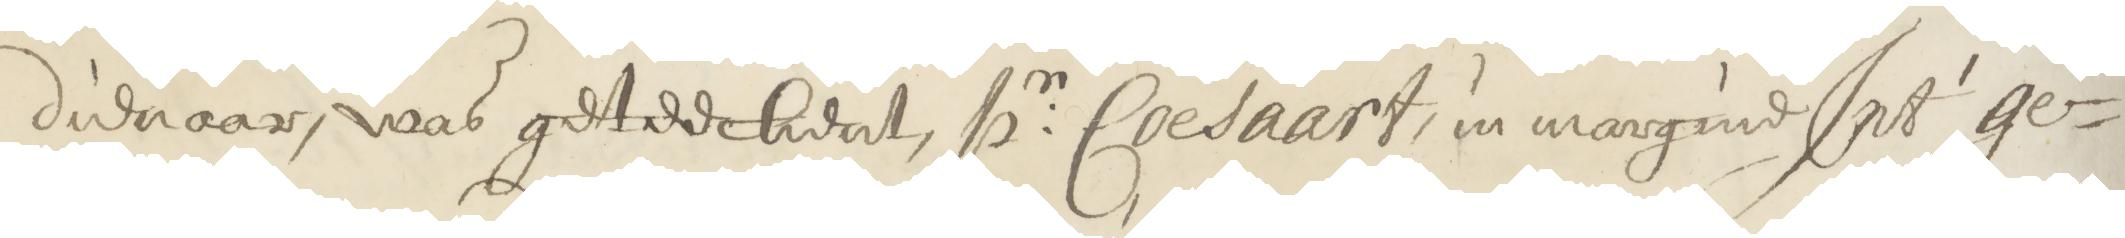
dienaar, was geteeckent, p:r coesaart, in margine Int' ge=
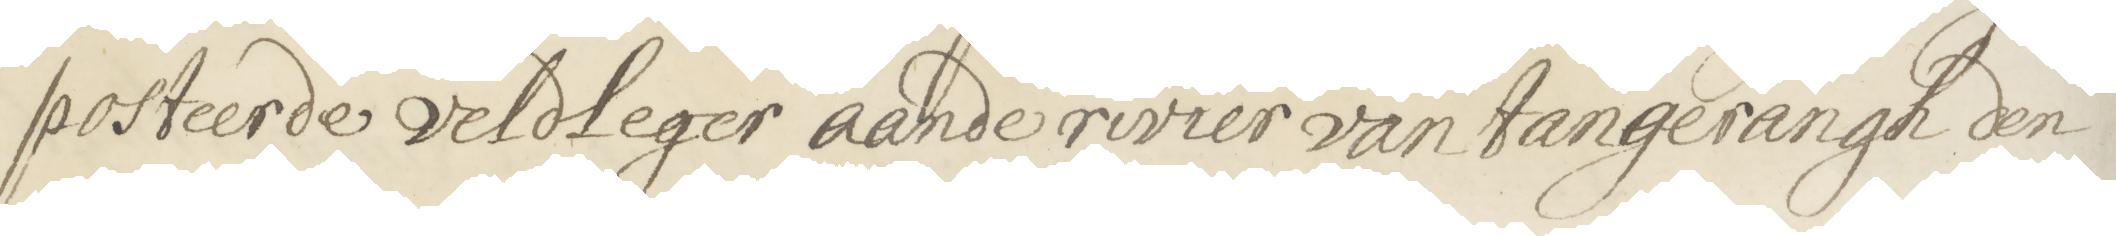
posteerde veldleger aande rivier van tangerangh den
